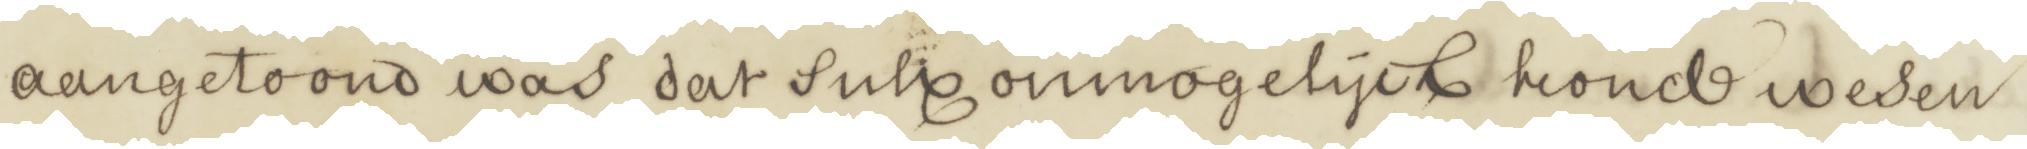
aangetoond was dat sulx onnogelijck konde wesen
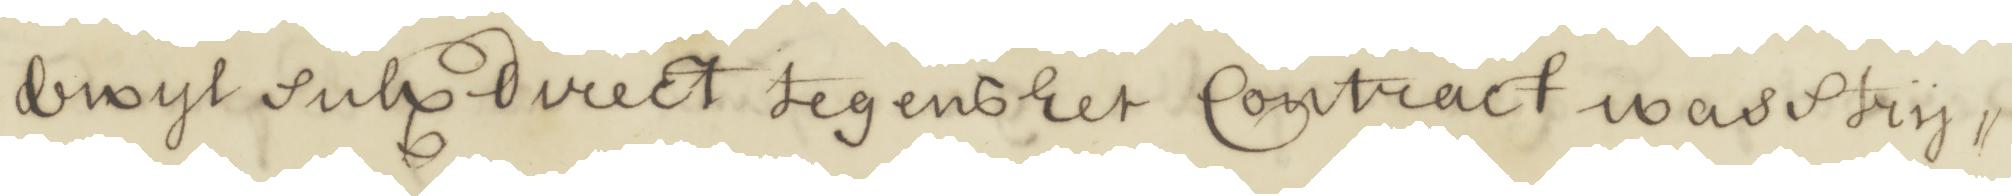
dewyl sulx direct tegens het Contract was strij„
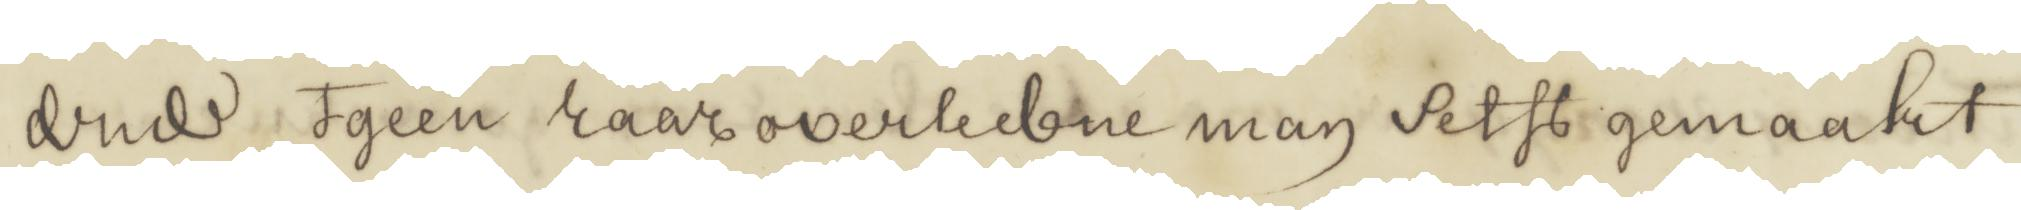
dende t geen haar overleedene man Selfs gemaakt
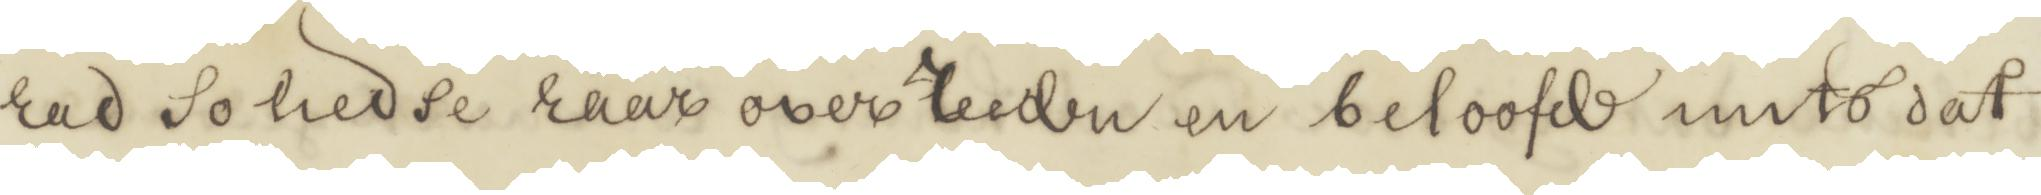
had So lied se haar over Reeden en beloofde mits dat
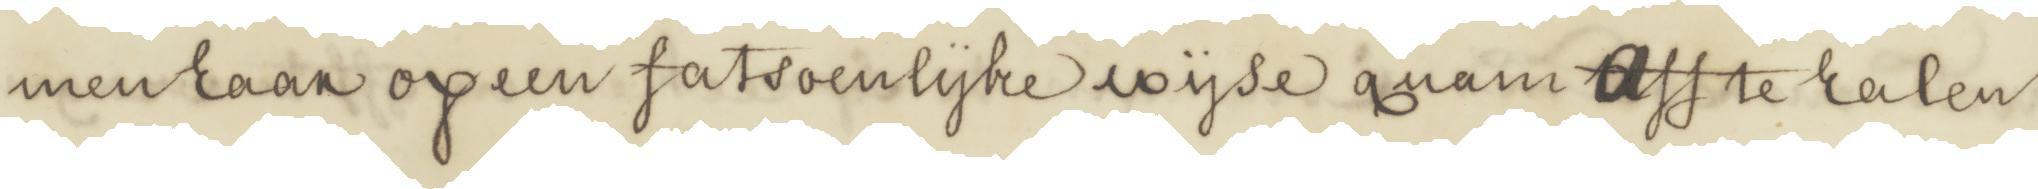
men haar op een fatsoenlijke wijse quam aff te halen
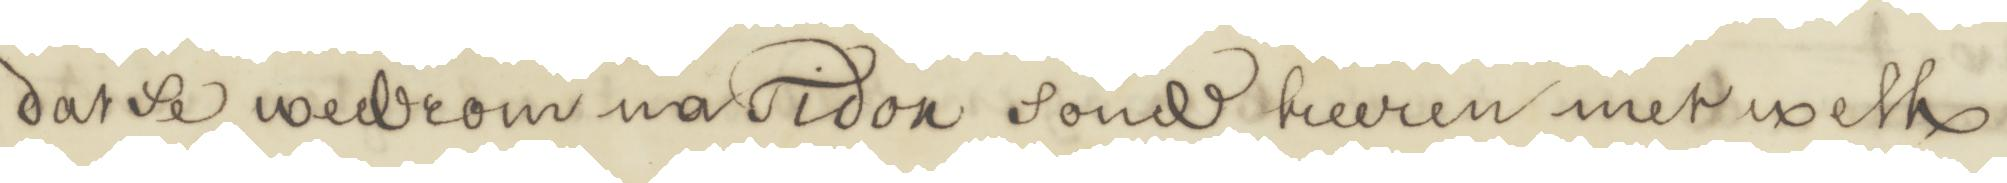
dat se wederom na Tidor soude keeren met welk
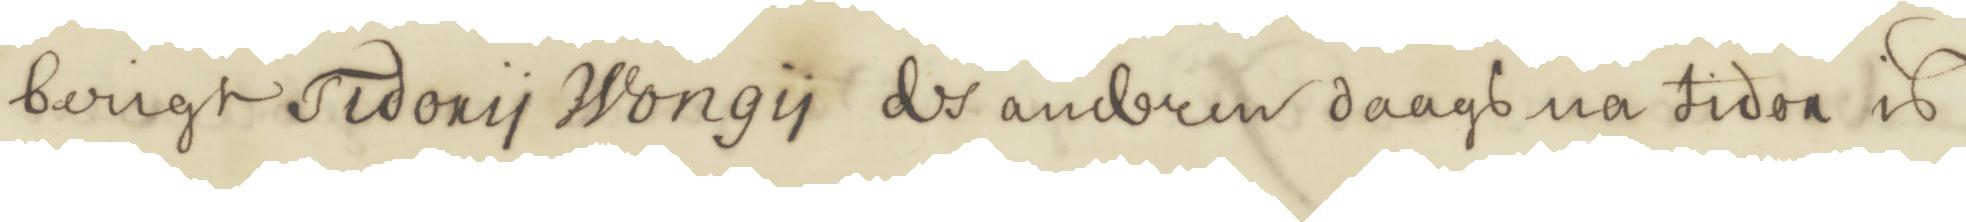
berigt Tidorij Wongij des anderen daags na tidor is
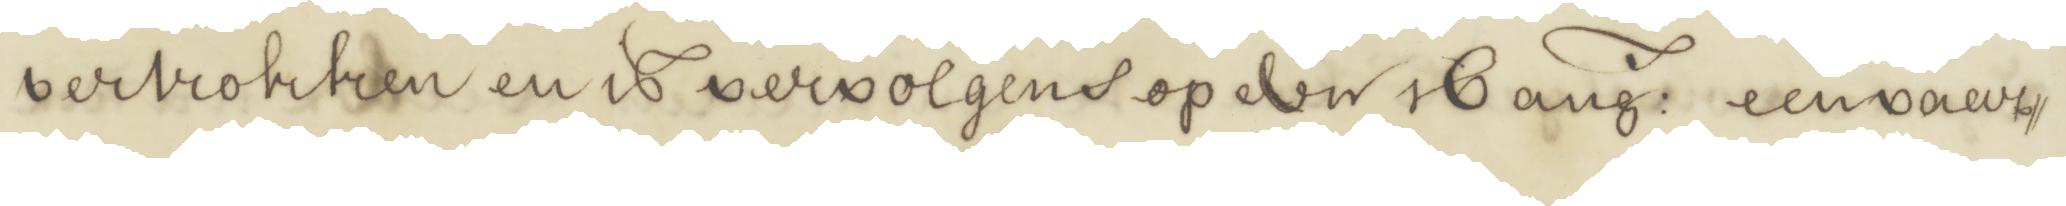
vertrokken en is vervolgens op den 16 aug: een vaar„
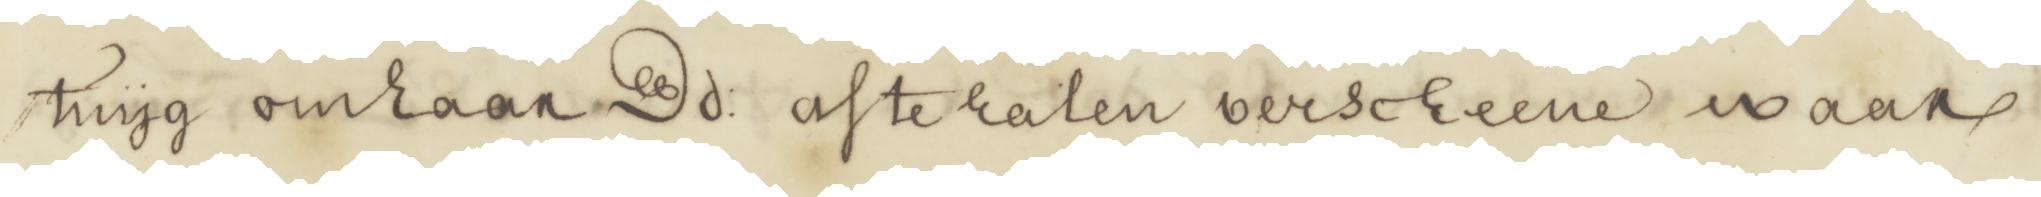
tuijg om haar Ed: afte halen verscheene waar
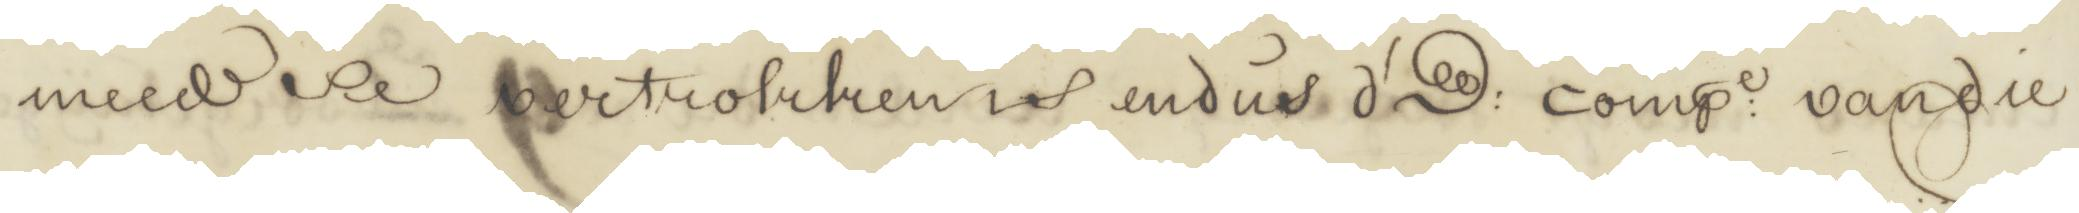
meede se vertrokken is en dus d’E: comp:e van die
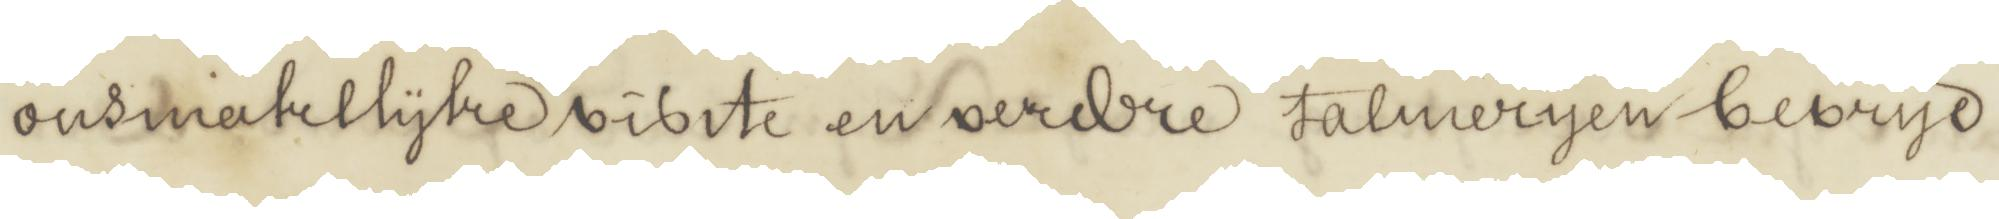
onsmakelijke visite en verdere talmerijen bevrijd
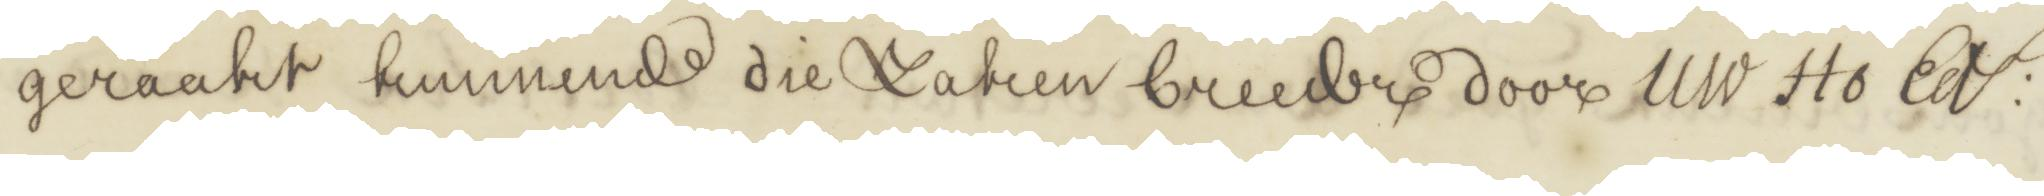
geraakt kunnende die Zaken breeder door UW Ho Ed:
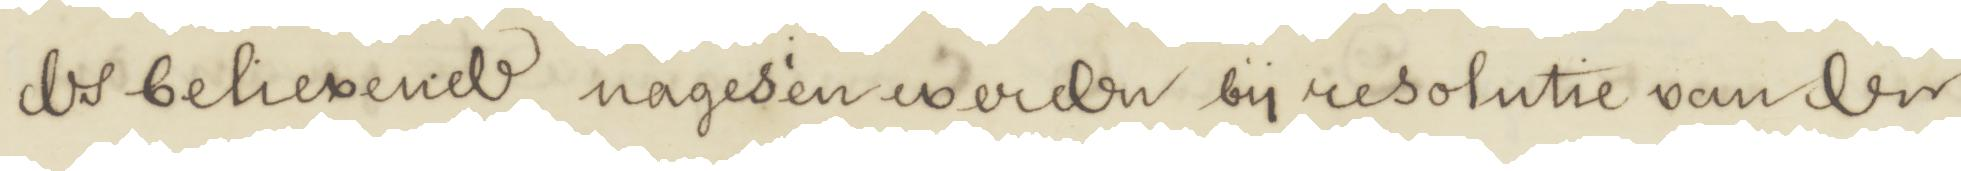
des believende nagesien werden bij resolutie van den
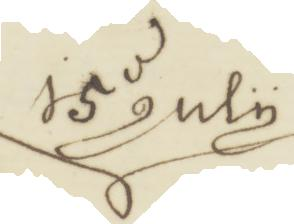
15e Julij
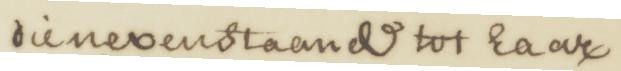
die nevenstaande tot haar
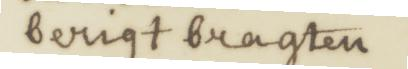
berigt bragten
